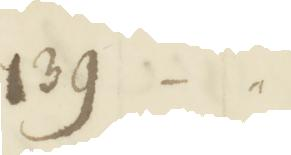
139 - „
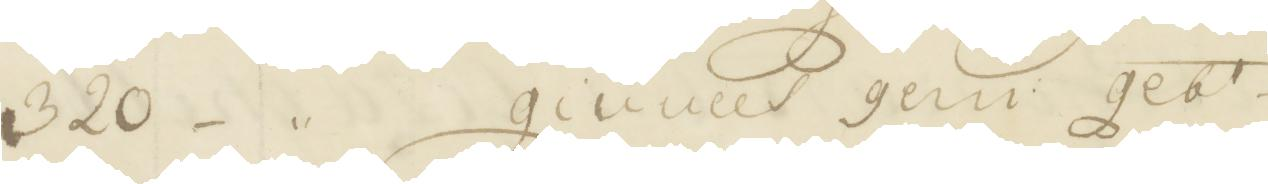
320 - „ guinees gem: gebt
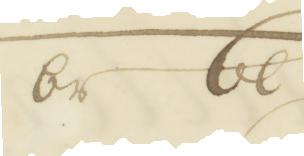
br bl
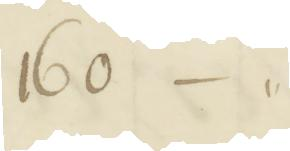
160 – „
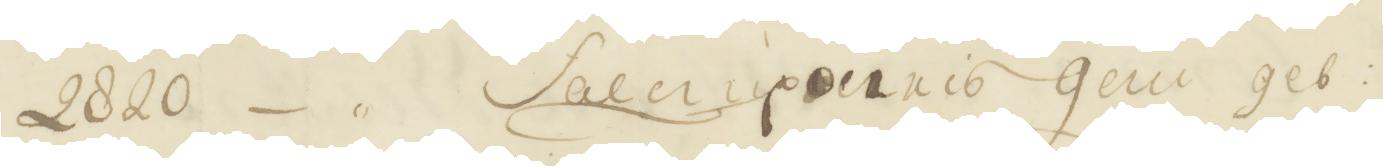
2820 – „ Salempouris gem geb.
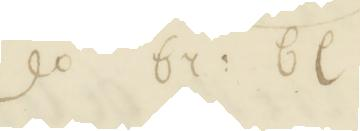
_o br: bl
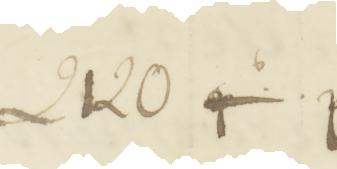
2120 p.s p.s
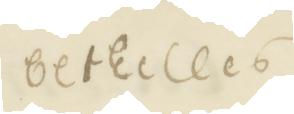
bethelles
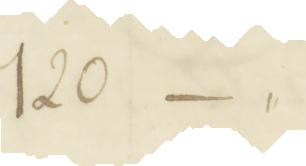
120 – „
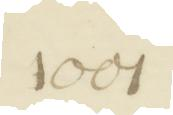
1001
